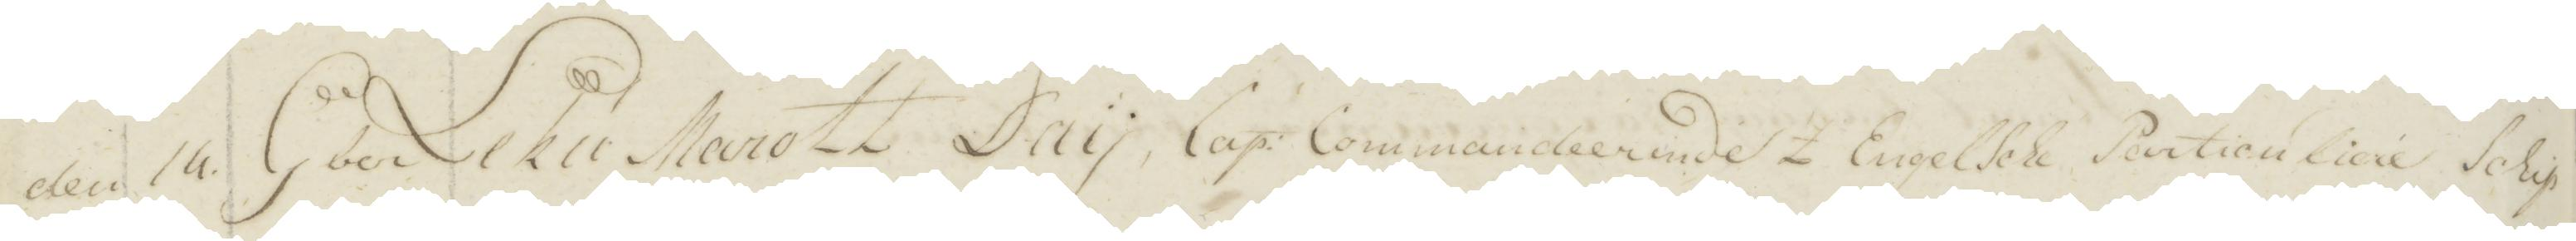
den 14. 9 ber Lekio Marott Daij, Cap: Commandeerende t Engelsche Particuliere Schip
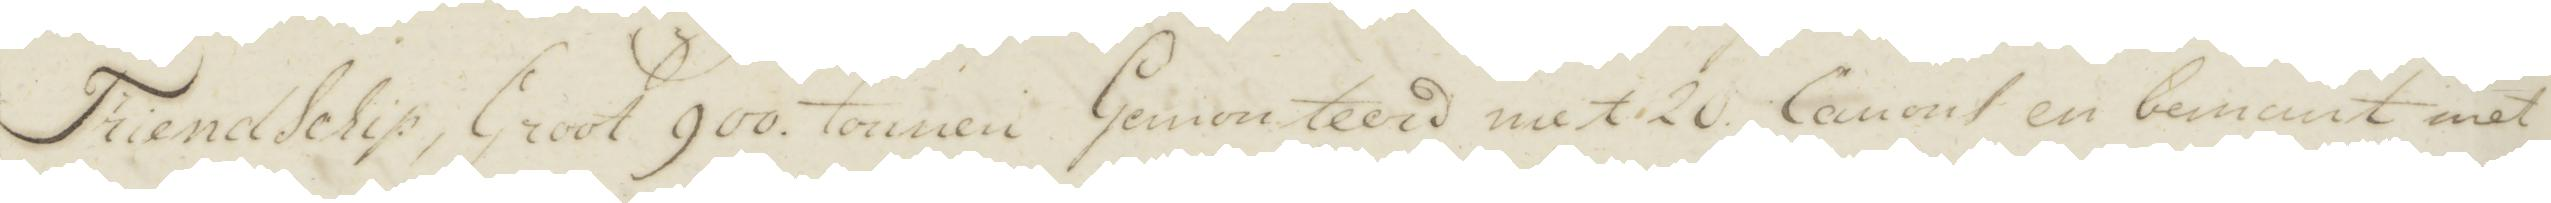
Friendschip, Groot 900: tonnen Gemonteerd met 20. Canons en bemant met
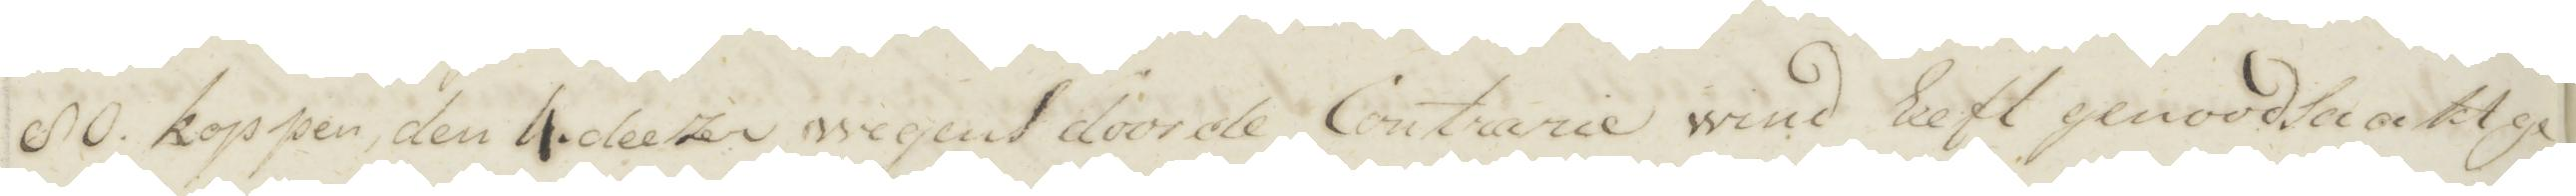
80. koppen, den 4. deezer wegens door de Contrarie wind heeft genoodsaakt ge
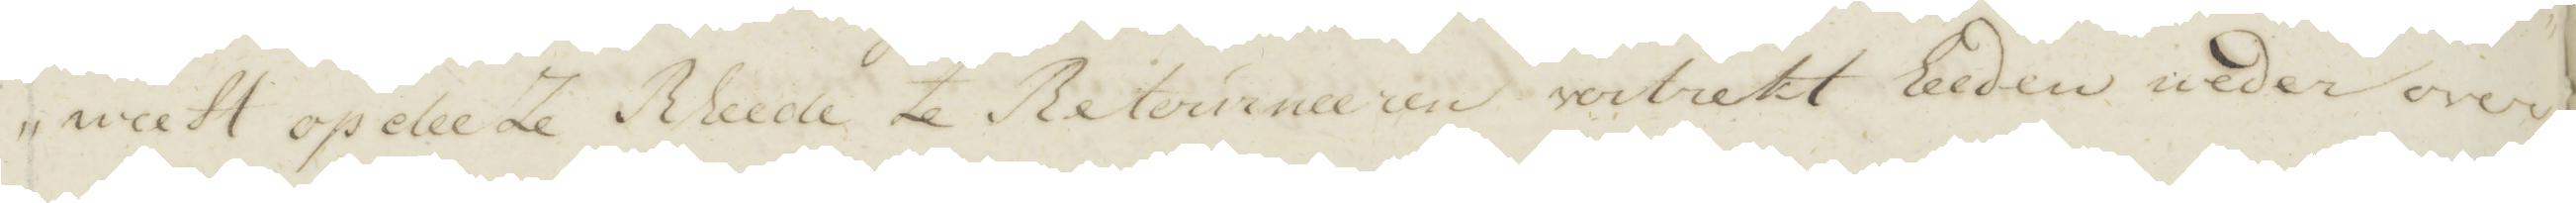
„weest op deeze Rheede te Retourneeren vertrekt heeden weder over
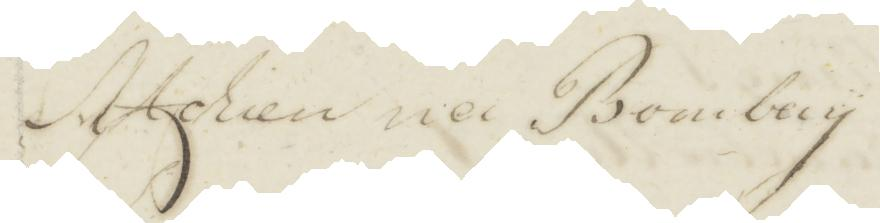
Atchien na Bombaij
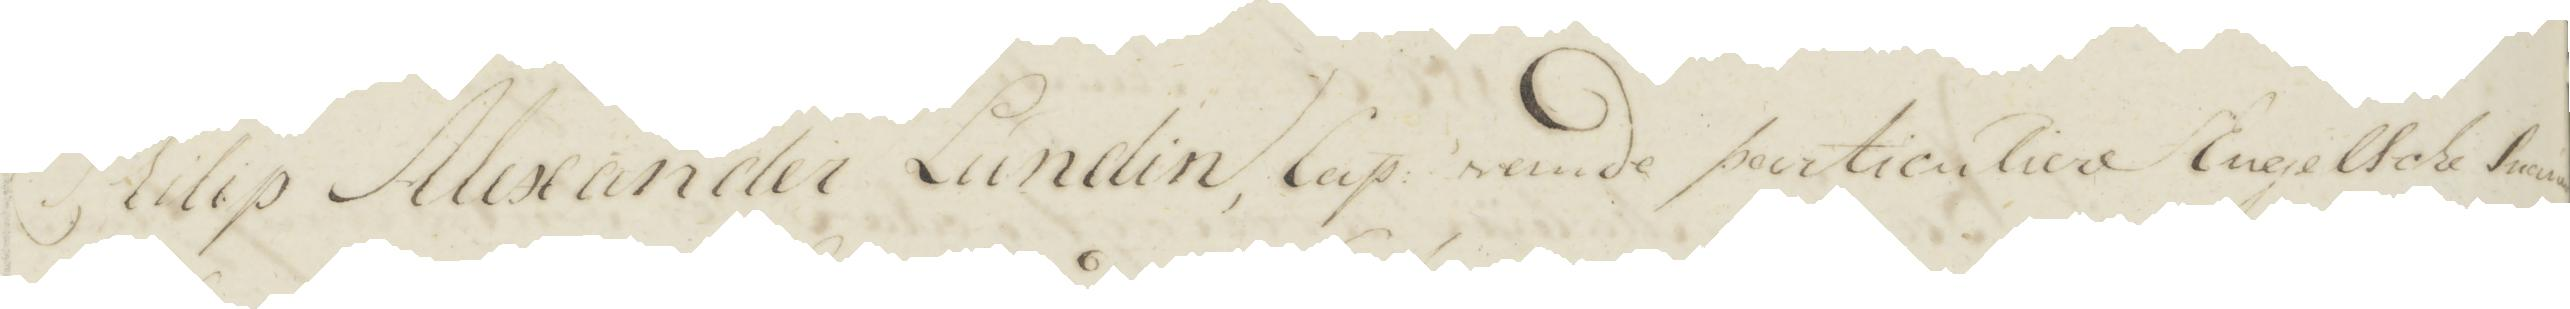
Schip Alexander Lundin, Cap: van de particuliere Engelsche Suca
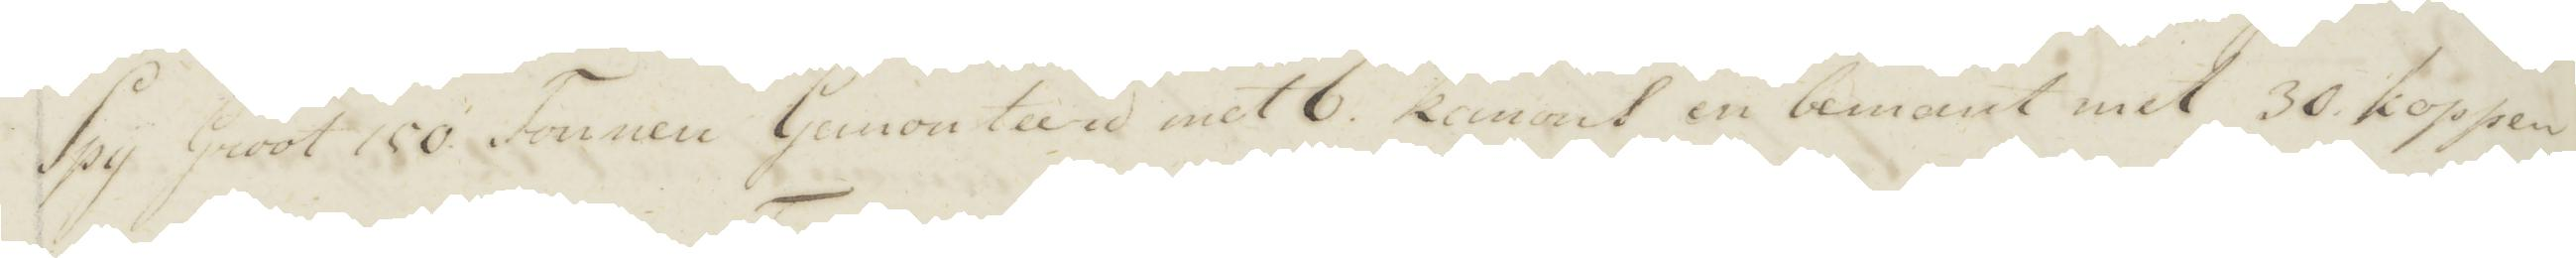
Spij Groot 150: Tonnen Gemonteerd met 6. kanons en bemant met 30. koppen
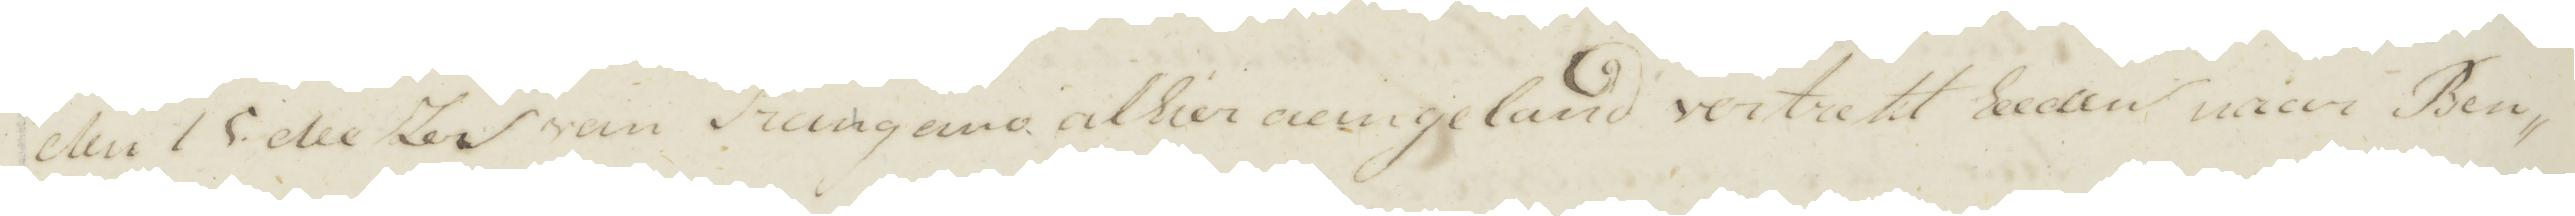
den 15. deezer van Trangano alhier aangeland vertrekt heden naar Ben„
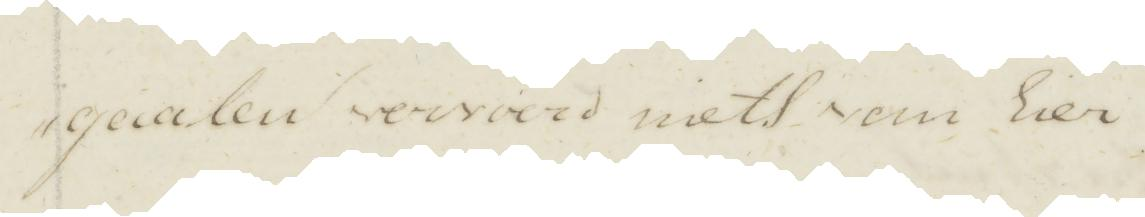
„gaalen vervoerd niets van hier
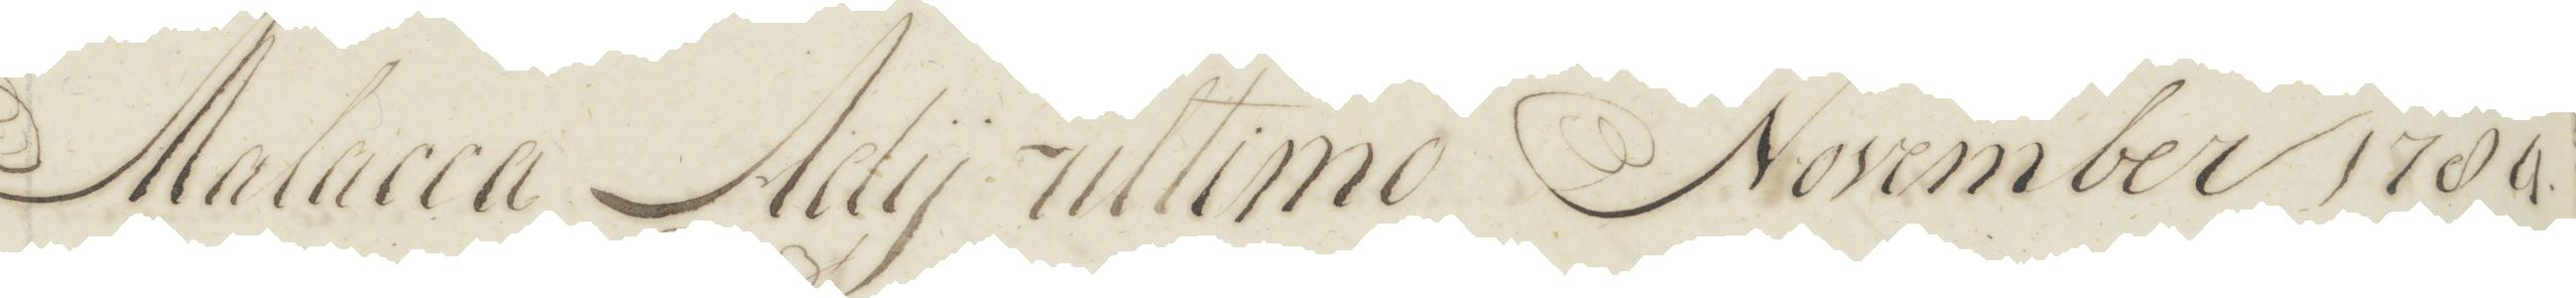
Malacca Adij ultimo November 1784.
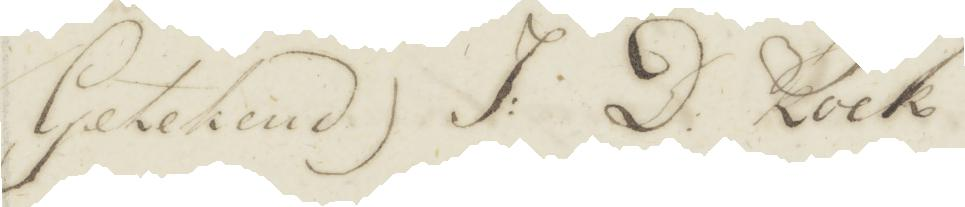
( Getekend) I: D: koek
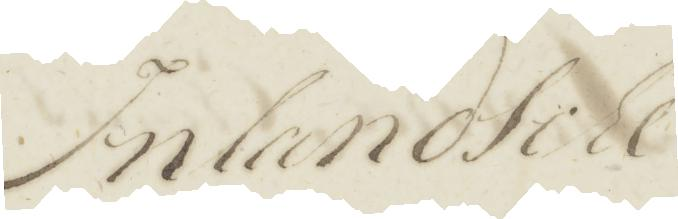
Inlandsche
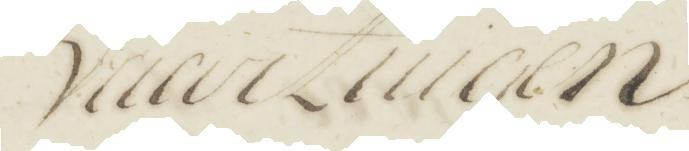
Vaartuigen
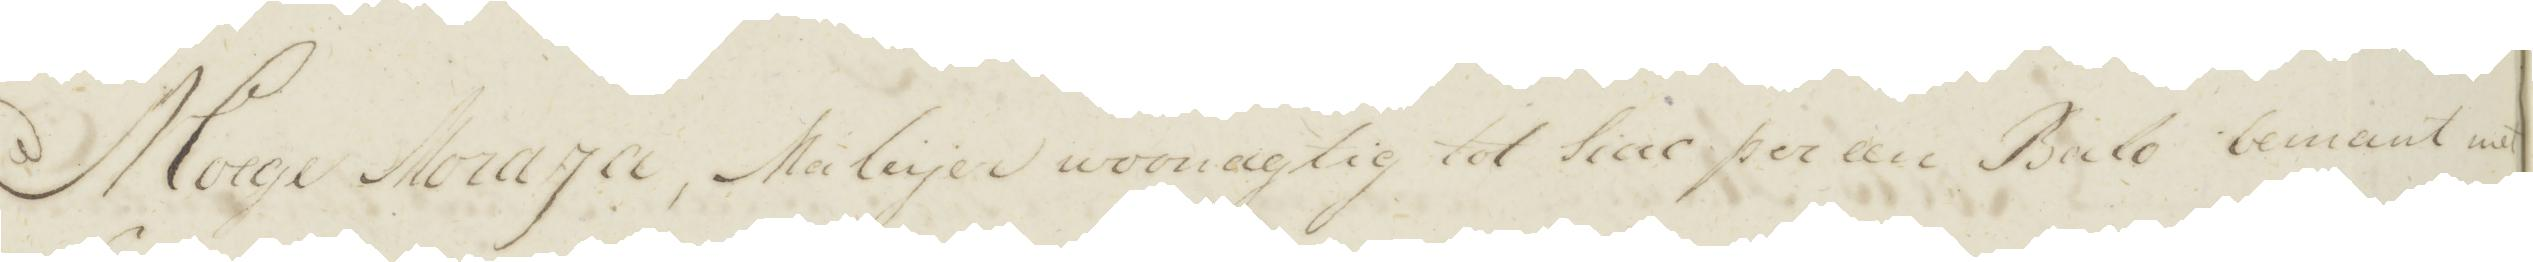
Moege Moraja, Maleijer woonagtig tot Siac per een Balo bemant met
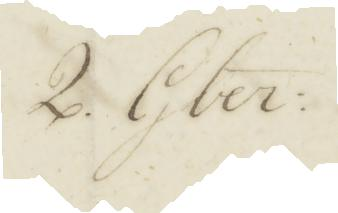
2. 9ber:
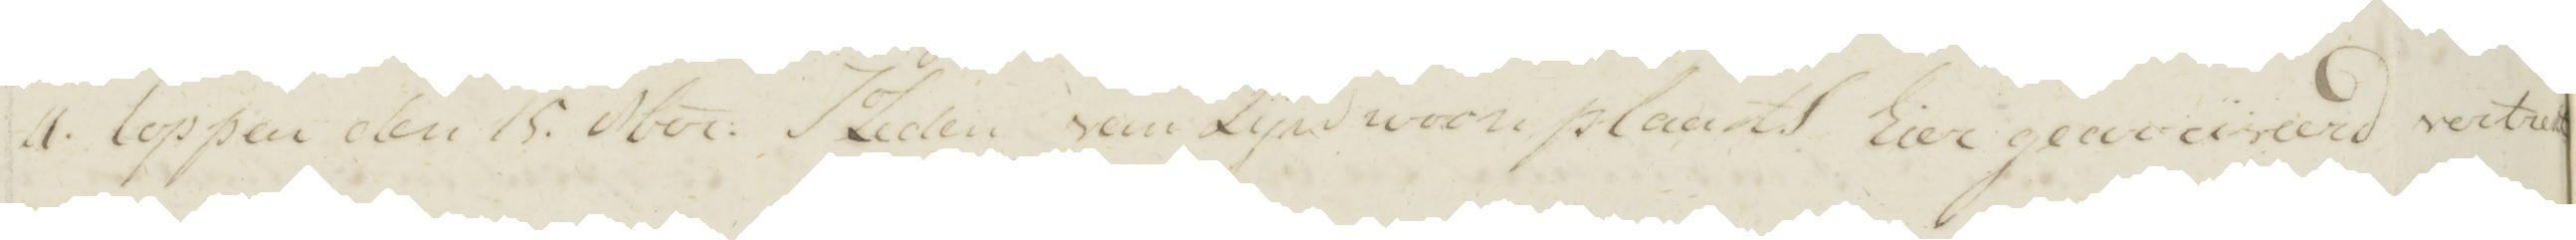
4. Coppen den 15. 8ber: Heden van Zijn woonplaats, hier gearriveerd vertrekt
